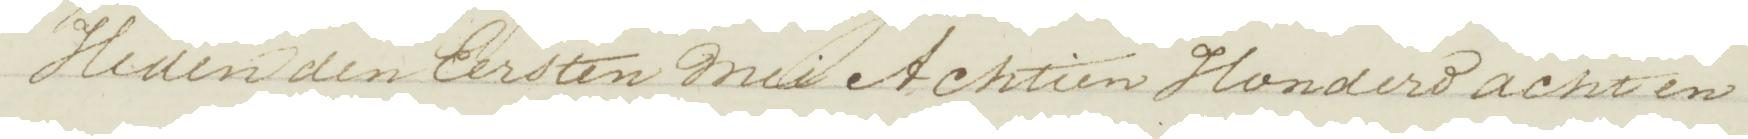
Heden den Eersten mei Achtien Honderd acht en
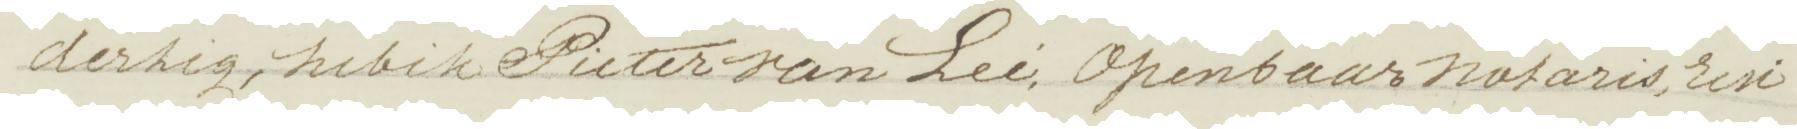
dertig, heb ik Pieter van Leé, Openbaar notaris, resi
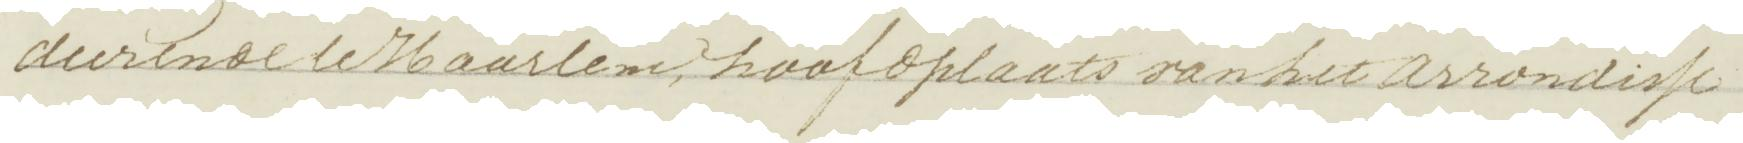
deerende te Haarlem, hoofdplaats van het arrondisse
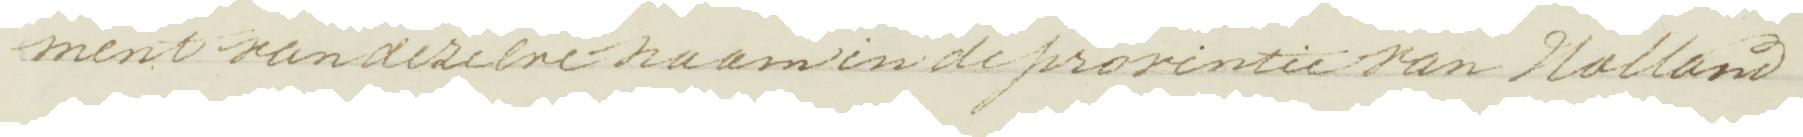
ment van dezelve naam in de provintie van Holland
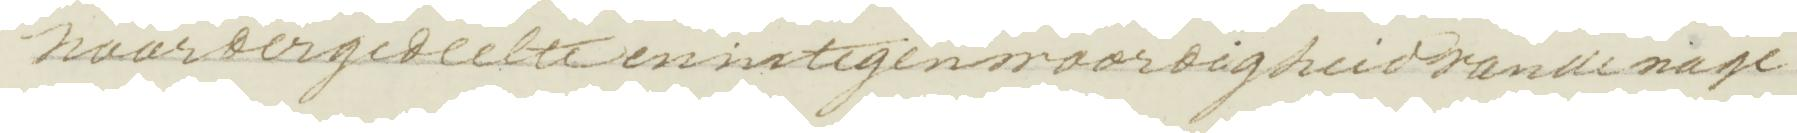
noordergedeelte en integenwoordigheid van de nage
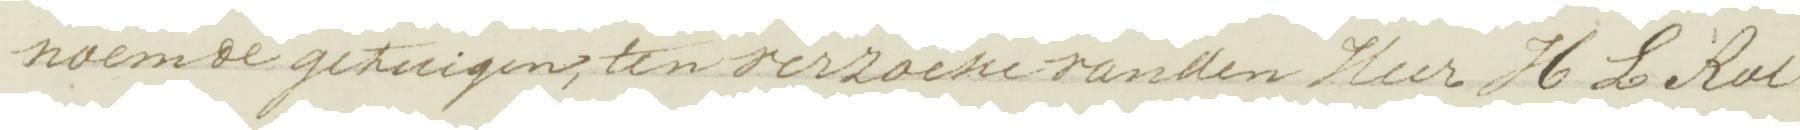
noemde getuigen, ten verzoeke van den Heer H L Rot
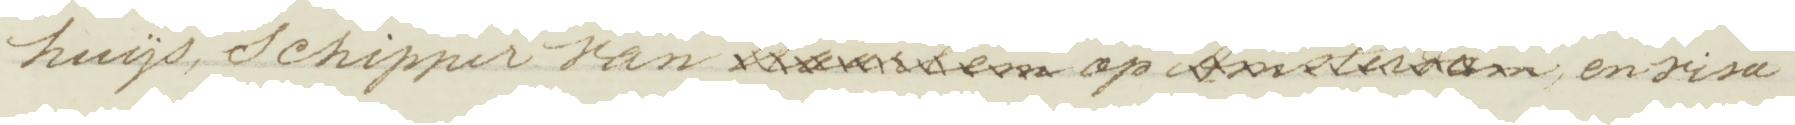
huijs, schipper van Haarlem op Amsterdam, en visa
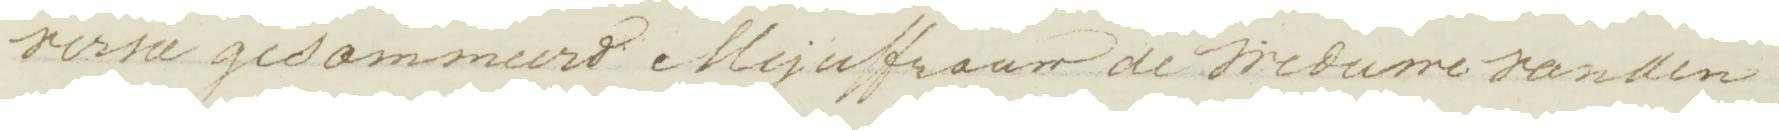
versa gesommeerd Mejuffrouw de weduwe van den
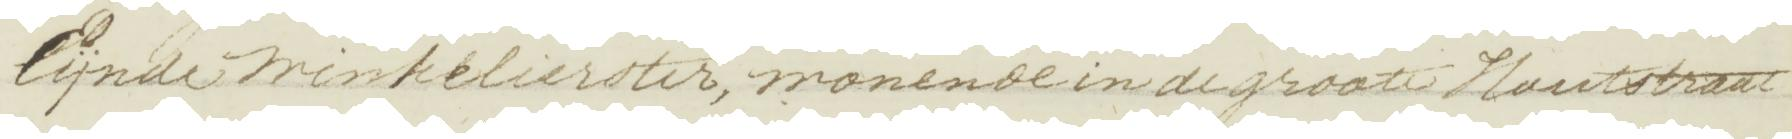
Eijnde wirkelierster, wonende in de groote Houtstraat
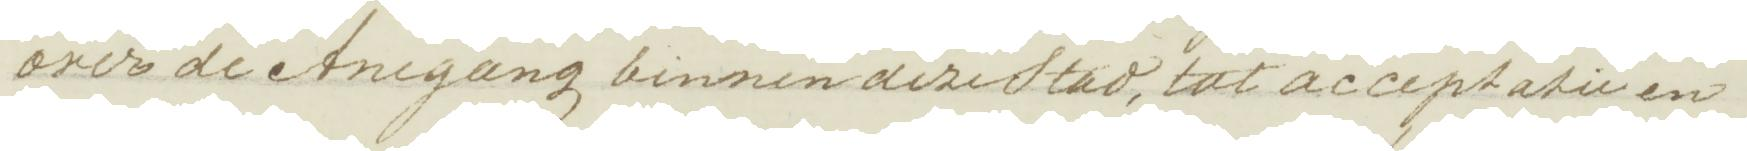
over de Anegang binnen deze stad, tot acceptatie en
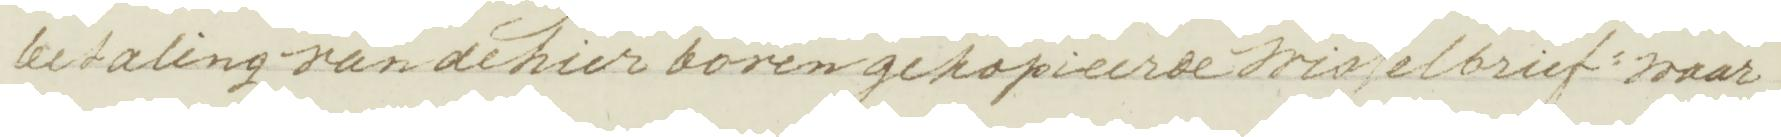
betaling van de hier boven gekopieerde wisselbrief "waar
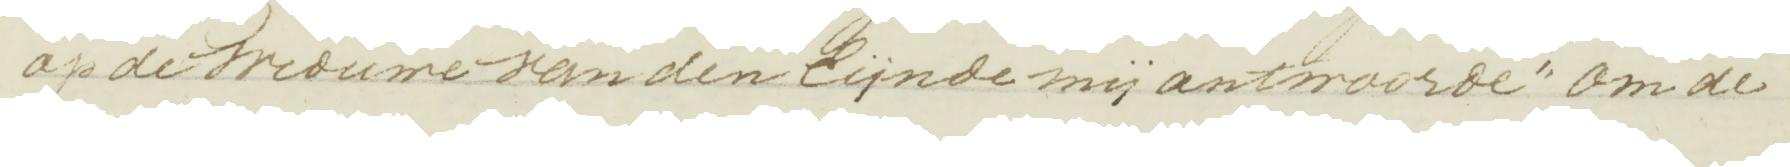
op de weduwe van den Eijnde mij antwoorde" om de
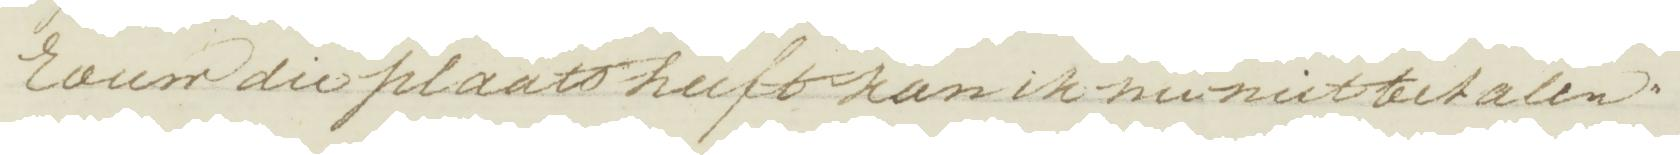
rouw die plaats heeft kan ik nu niet betalen"
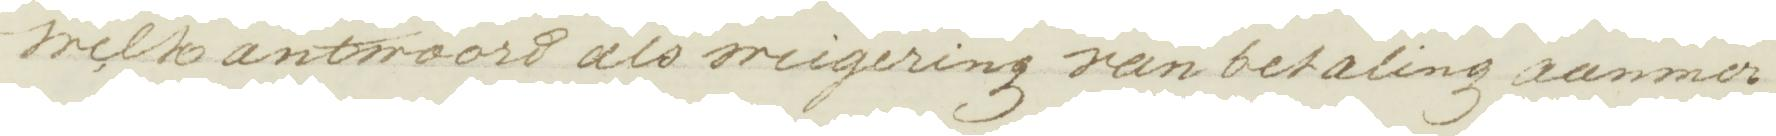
welk antwoord als weigering van betaling aanmer
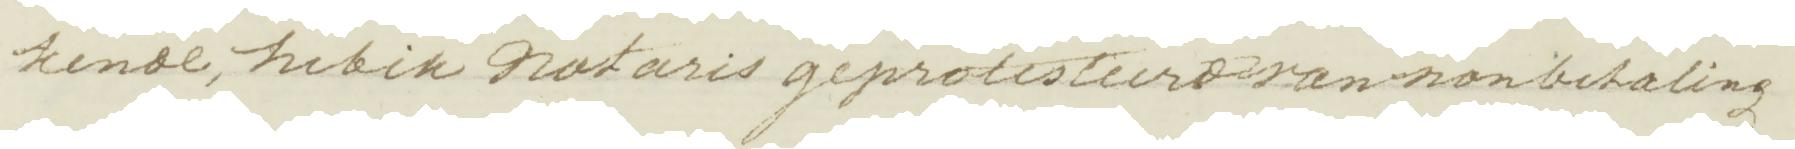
kende, heb ik notaris geprotesteerd van nonbetaling
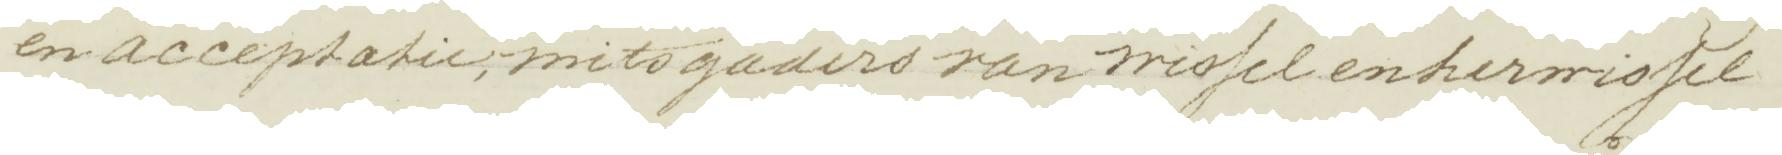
en acceptatie, mitsgaders van wissel enherwissel
